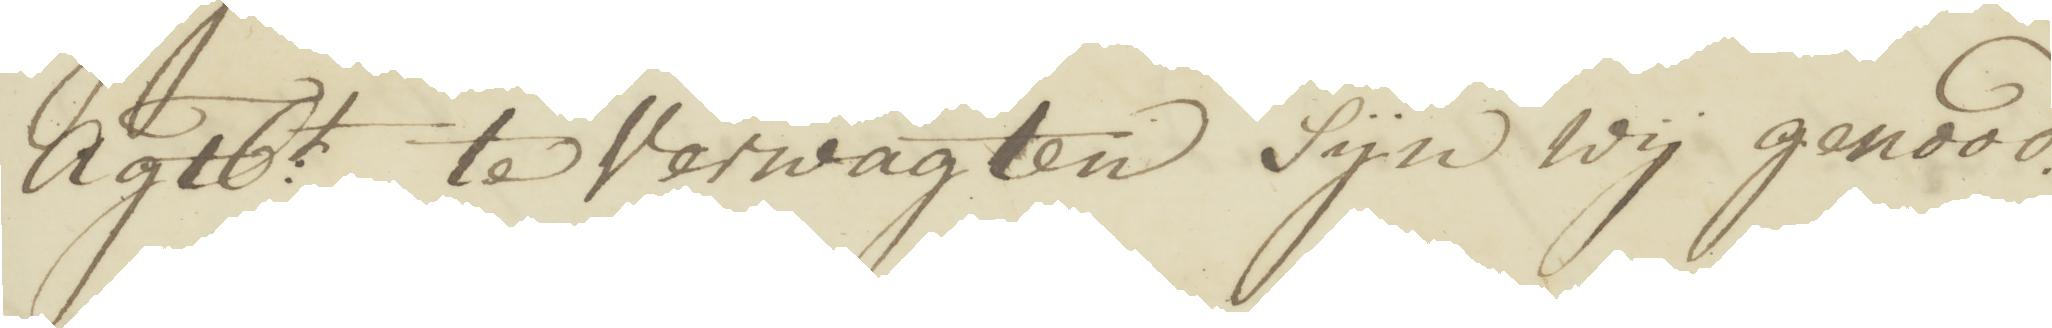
Agtb:t te verwagten sijn wij genood„
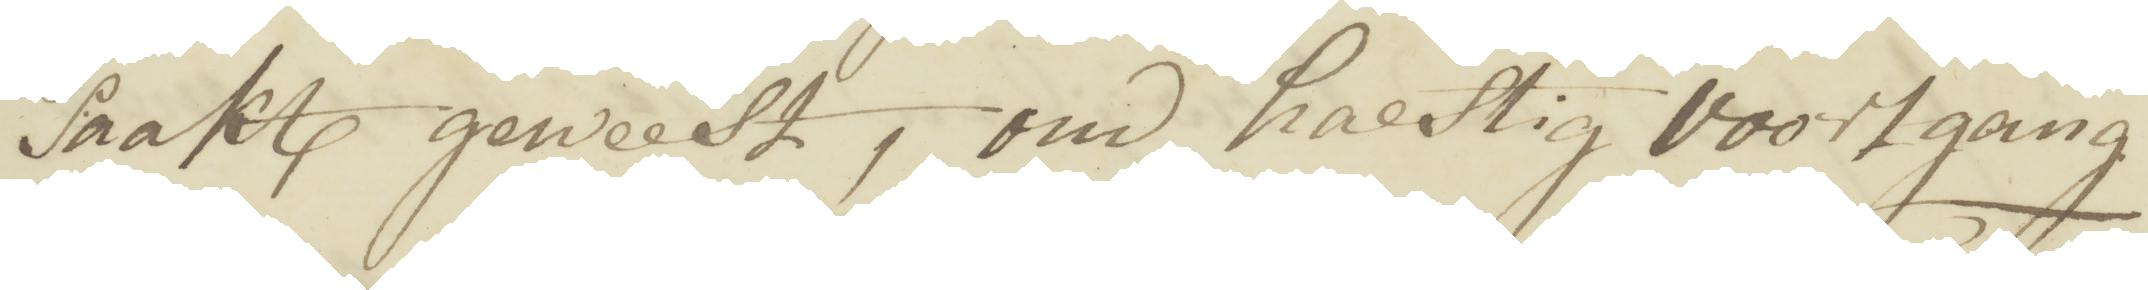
saakt geweest, om haestig voortgang
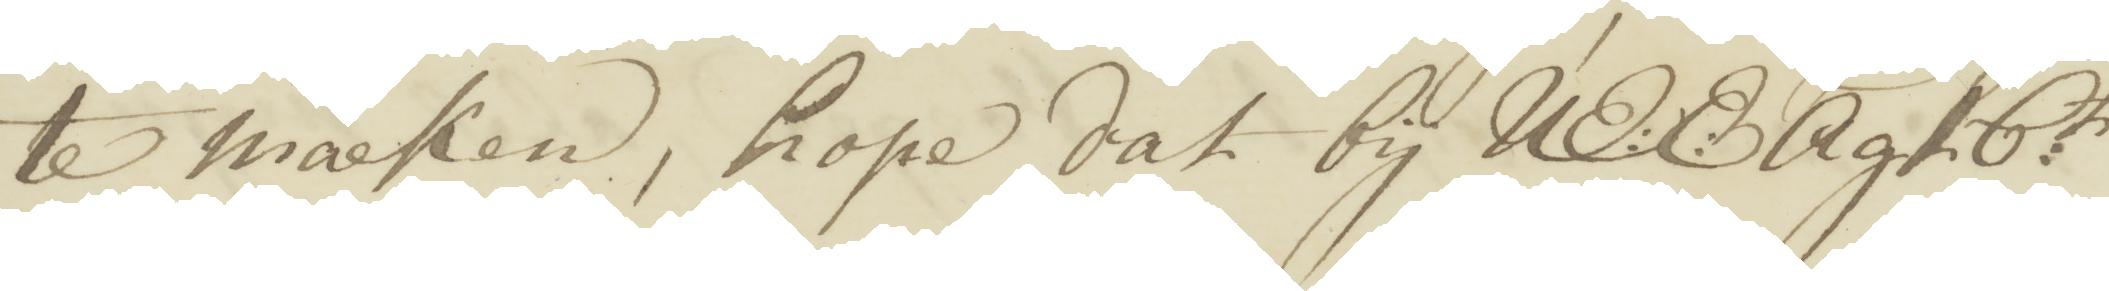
te maeken, hope dat bij UE:E: Agtb:t
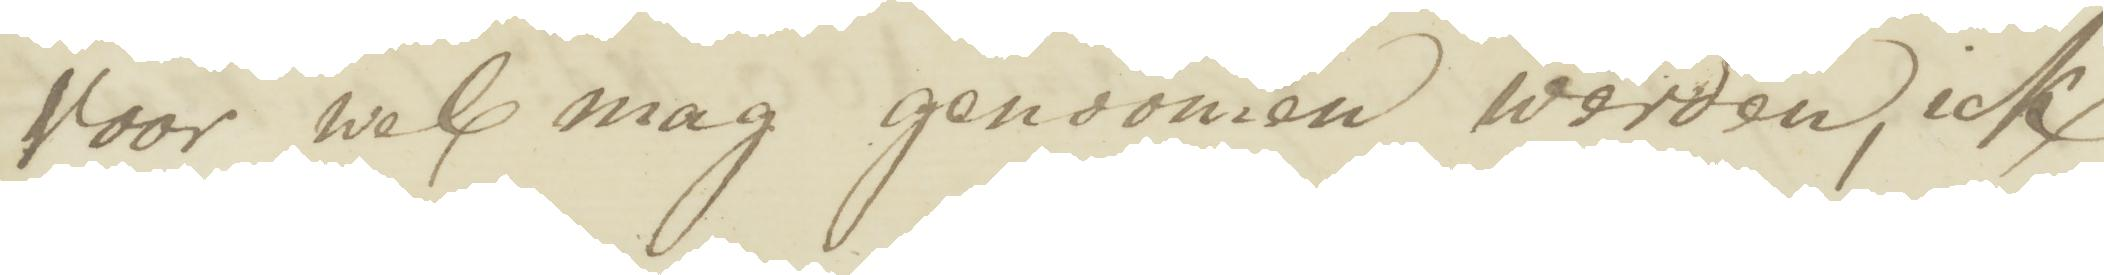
voor wel mag genoomen werden, ick
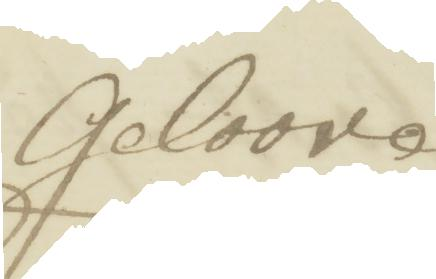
Geloove
